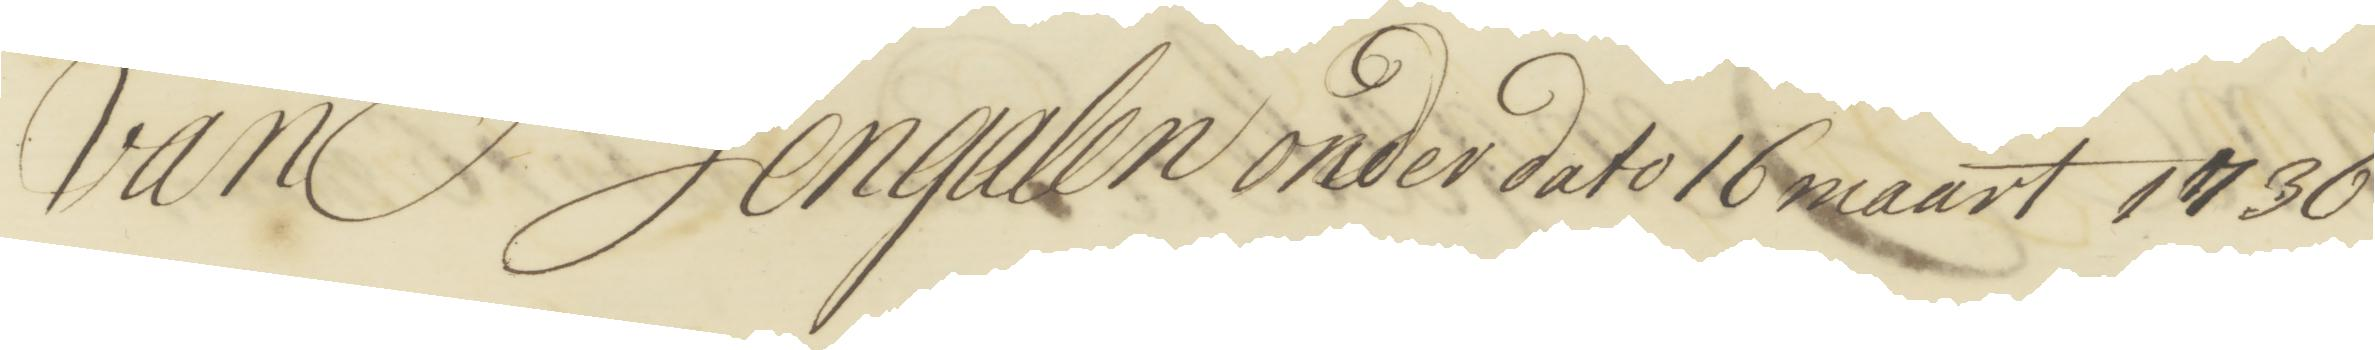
Van Bengalen onder dato 16 maart 1736
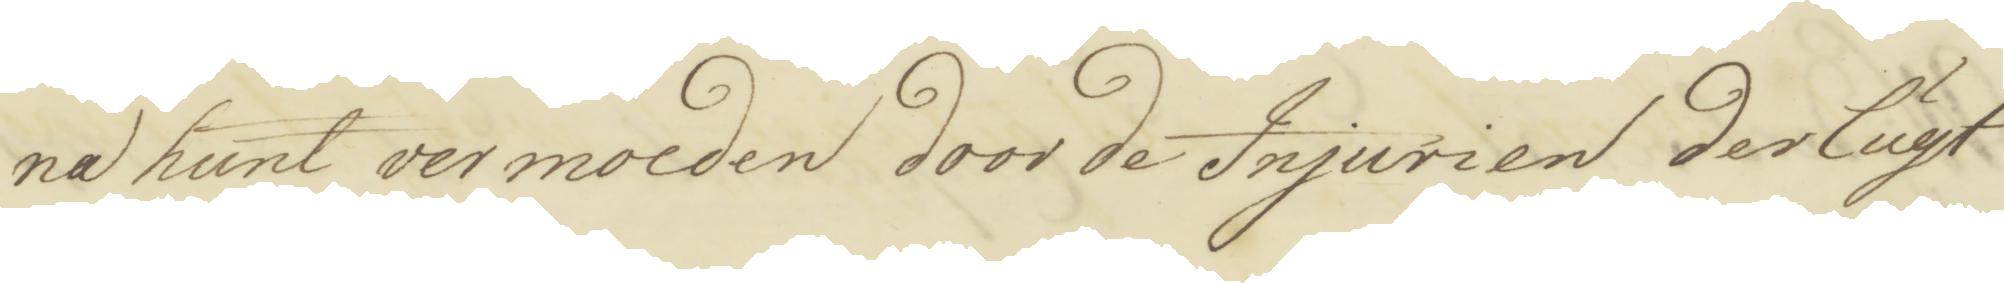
na kunt vermoeden door de Injurien der lugt
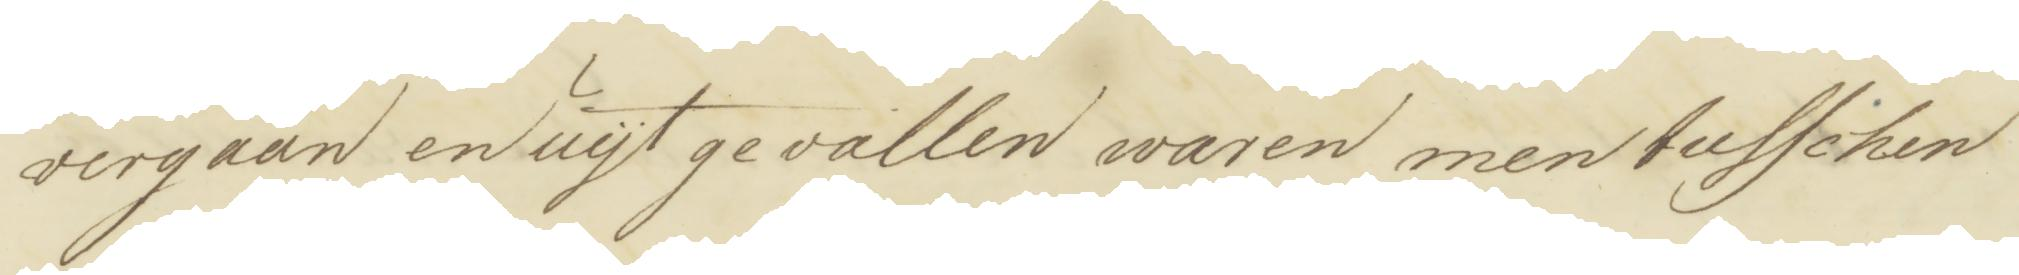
vergaan en uijt gevallen waren men tusschen
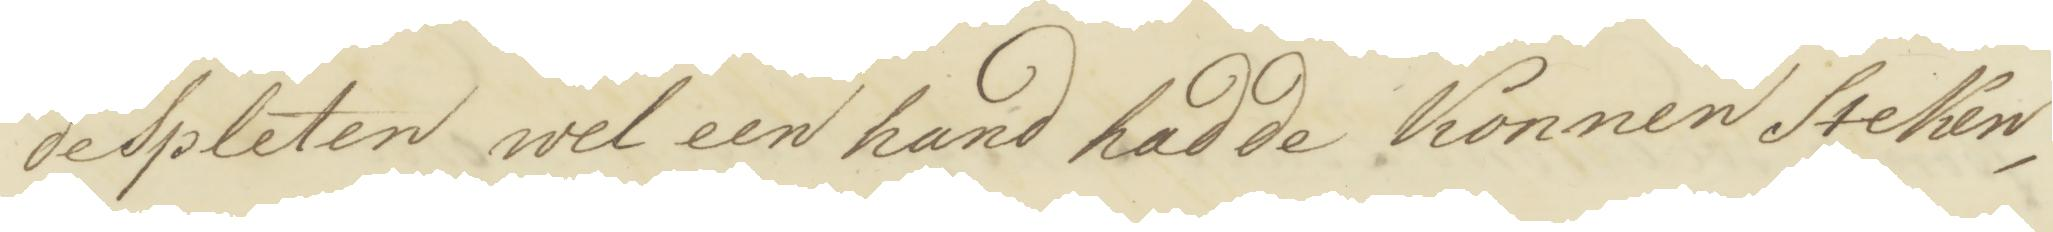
de spleten wel een hand hadde konnen steken,
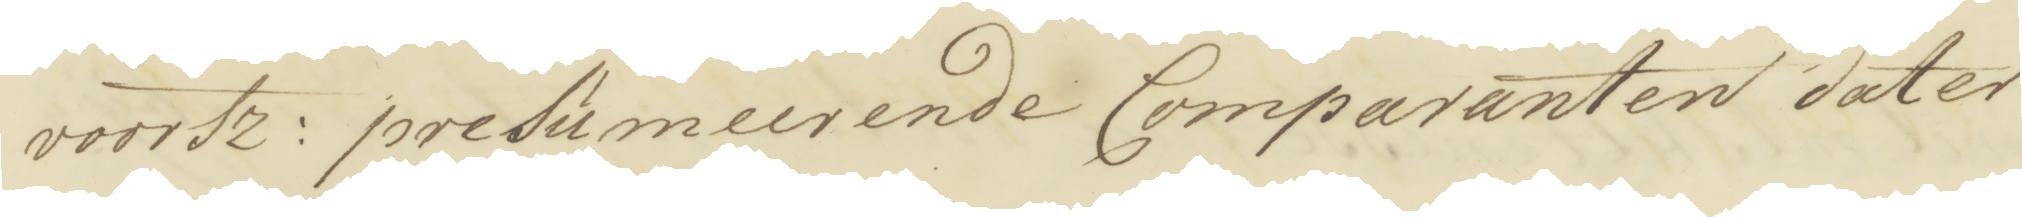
voortz: presumeerende Comparanten dat er
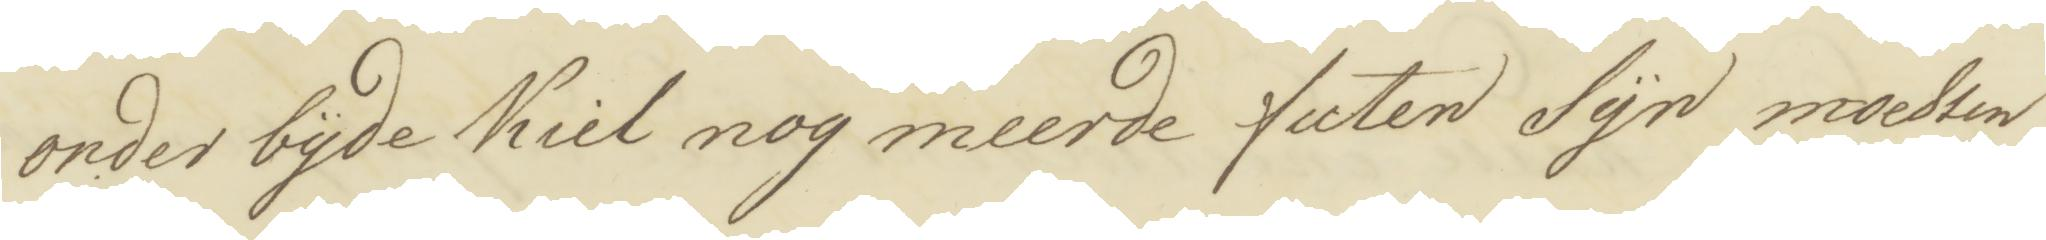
onder bijde kiel nog meerde futen sijn moesten
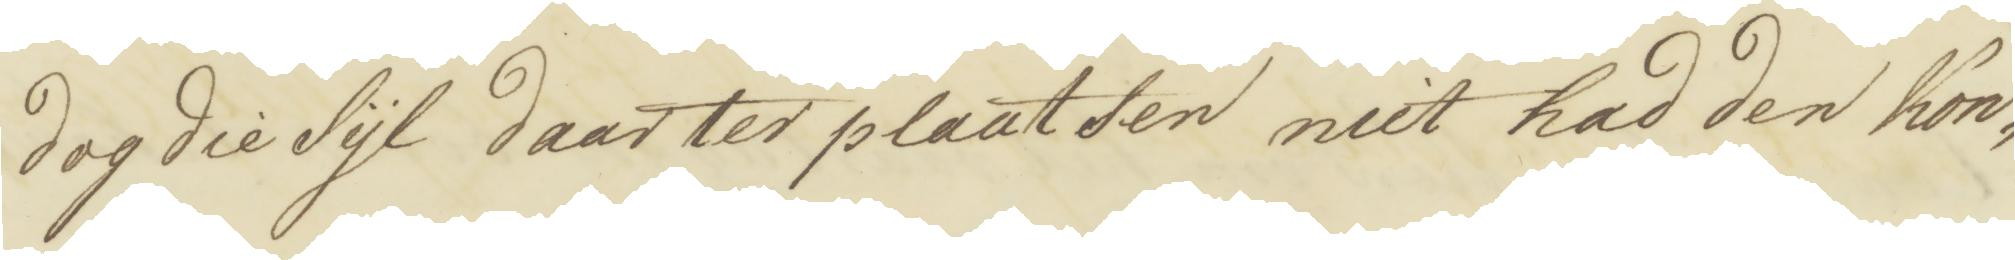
dog die sijl daar ter plaatsen niet hadden kon„
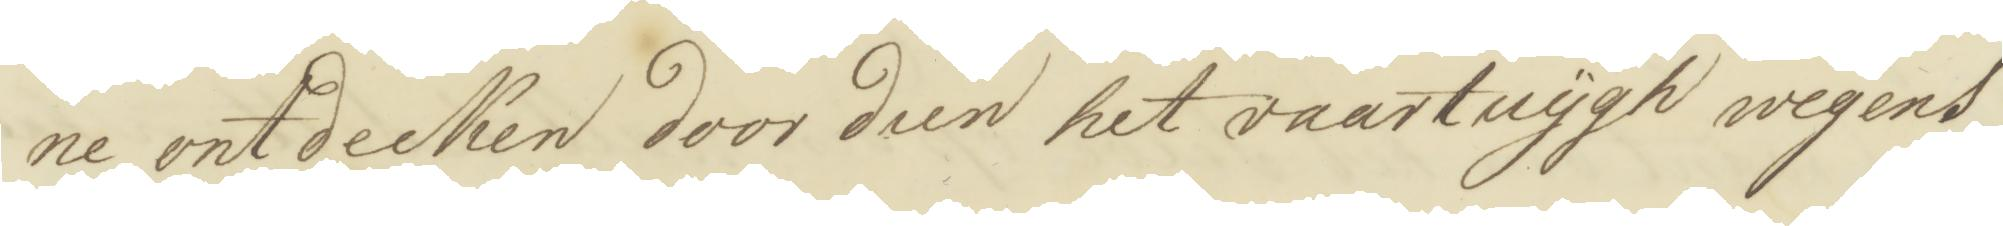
ne ontdecken door dien het vaartuijgh wegens
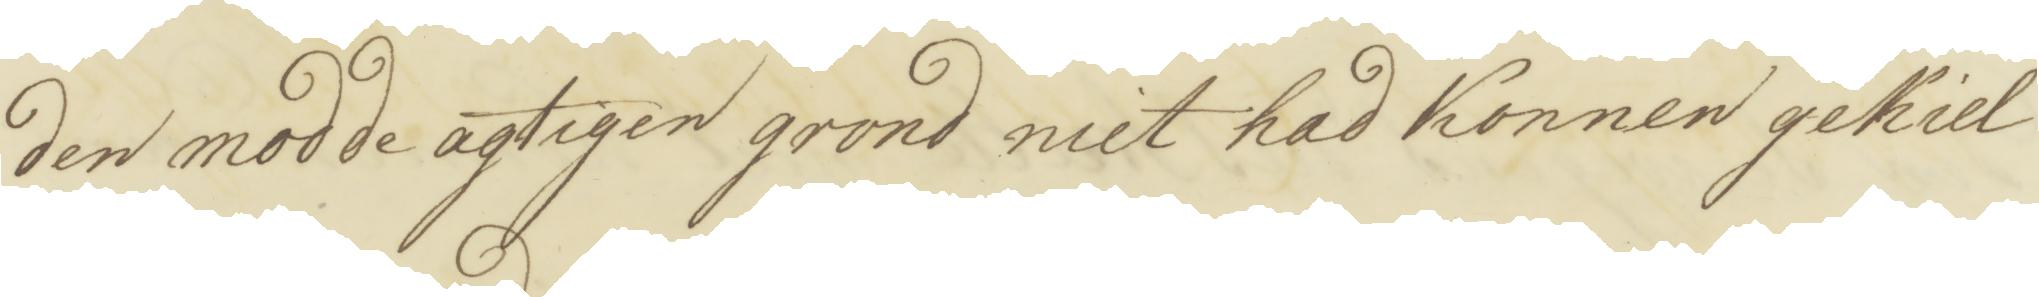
den modde agtigen grond niet had konnen gekiel
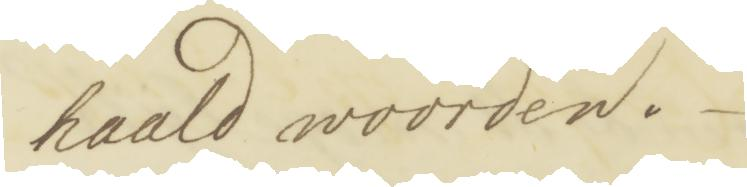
haald woorden.
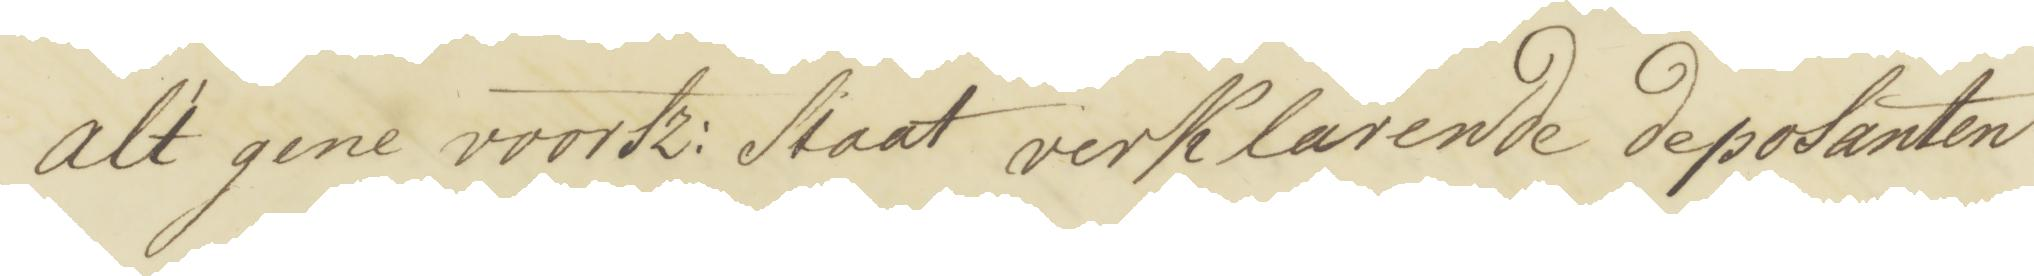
al't gene voorsz: staat verklarende deposanten
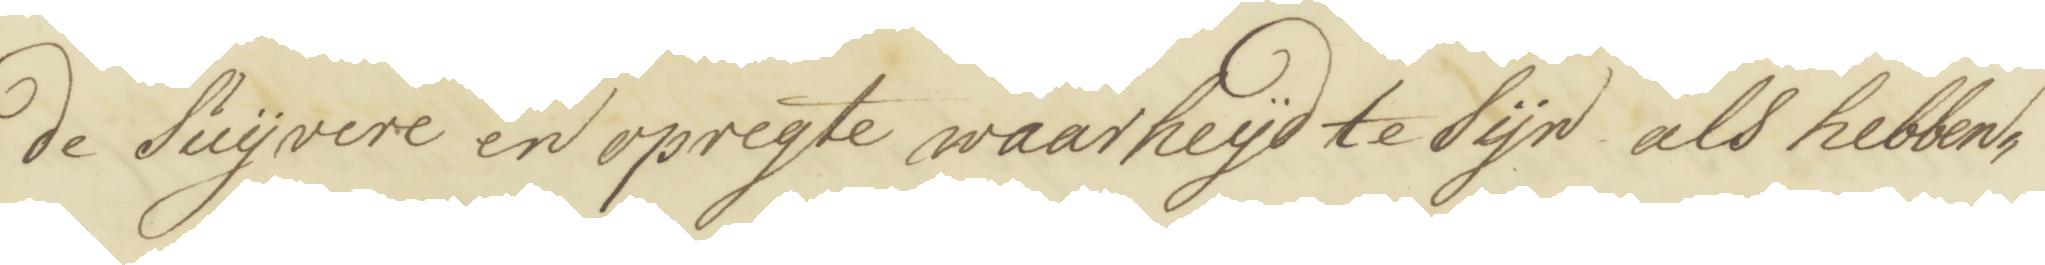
de suijvere en opregte waarheijd te sijn als hebben„
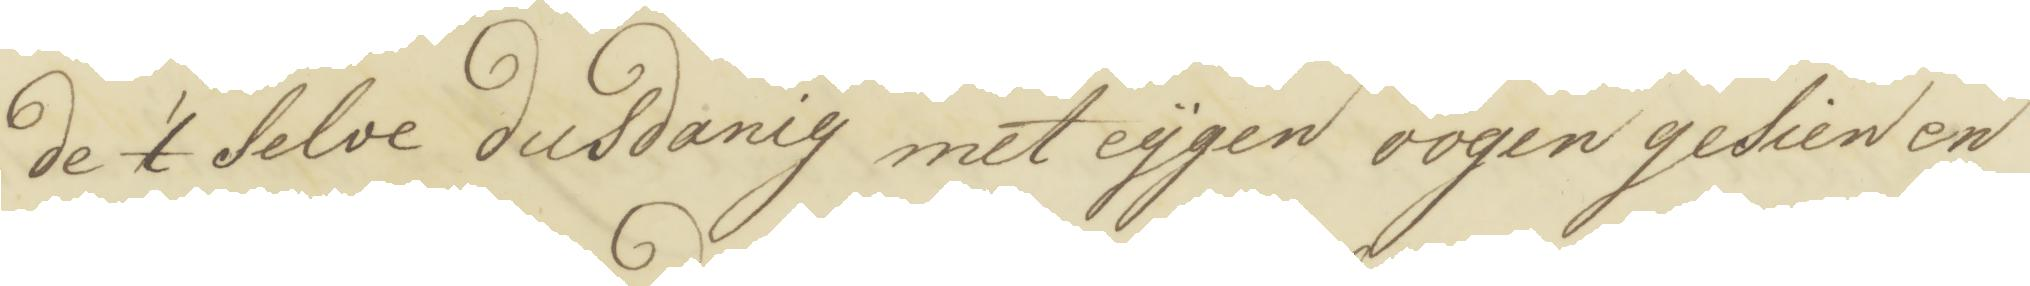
de ’t selve dusdanig met eijgen oogen gesien en
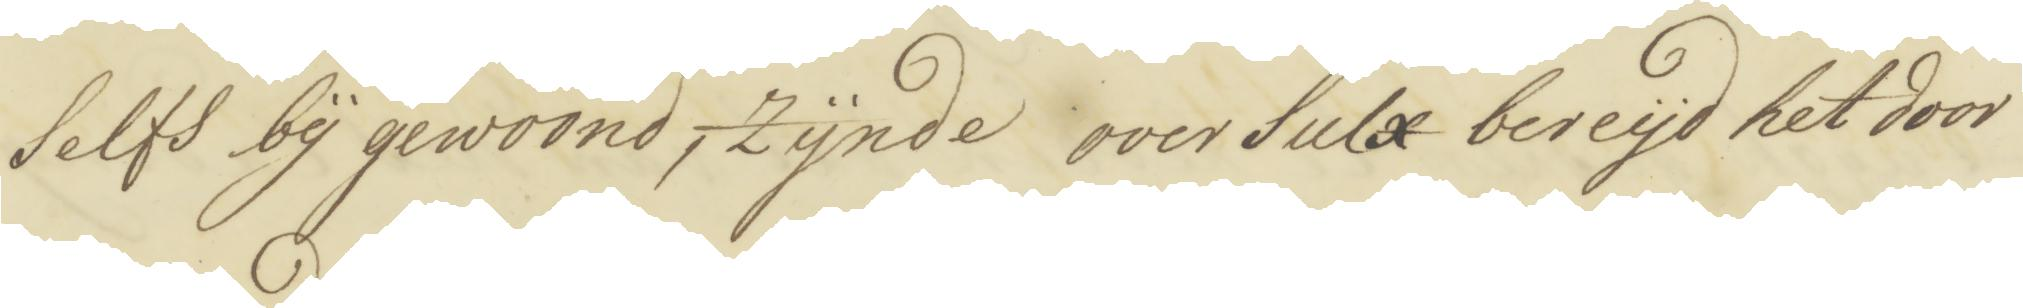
selfs bij gewoond, zijnde over sulx bereijd het door
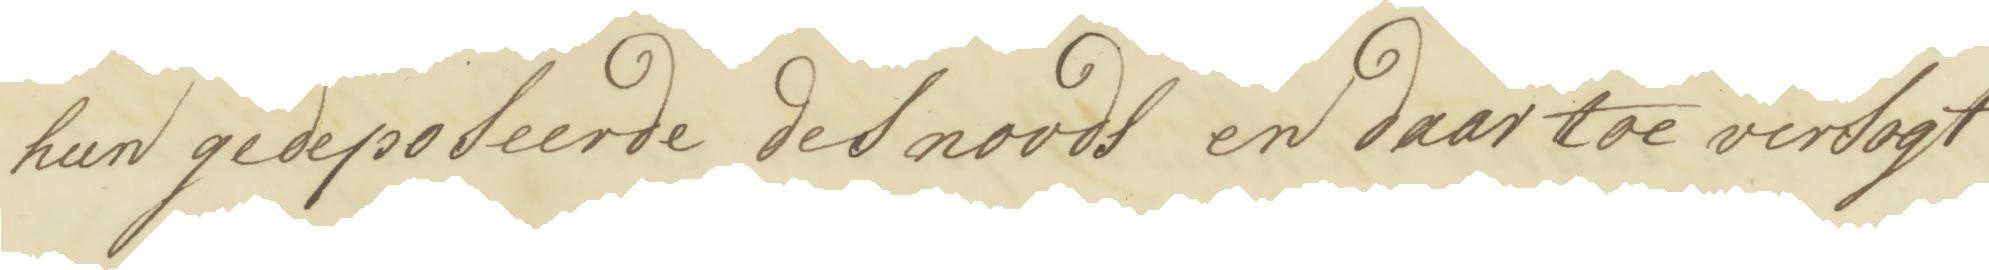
hun gedeposeerde des noods en daar toe versogt
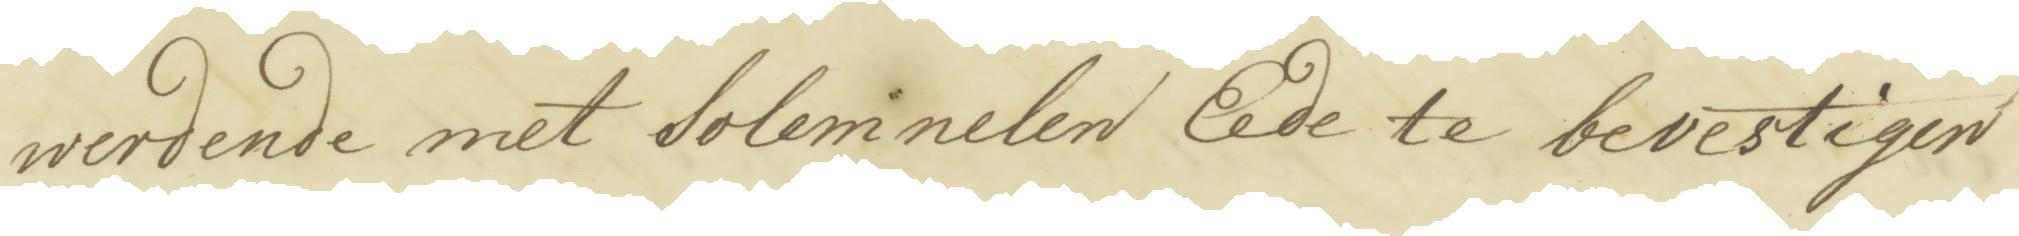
werdende met solemnelen Eede te bevestigen
